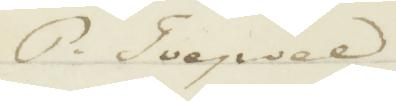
P: Toepoel
